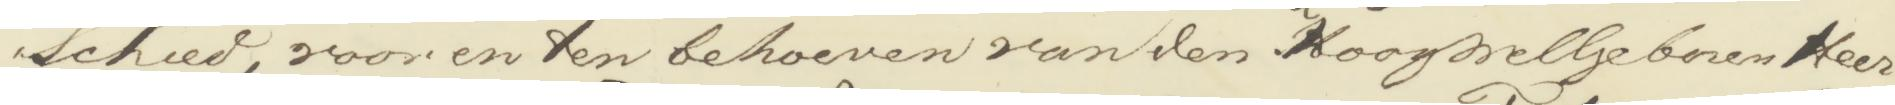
„schied, voor en ten behoeven van den HoogwelGeboren Heer
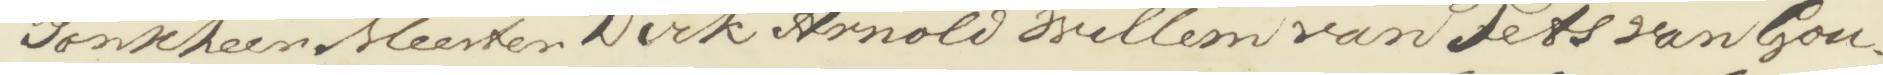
Jonkheer Meester Dirk Arnold Willem van Tets van Gou,
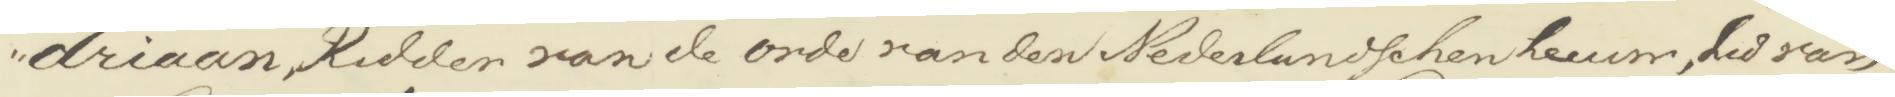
„driaan, Ridder van de orde van der Nederlandschen Leeuw, lid van
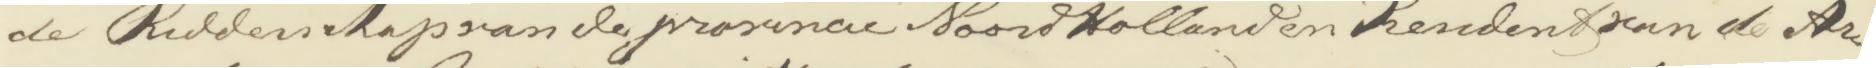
de Ridderschap van de province Noord Holland en Resident van de Ar
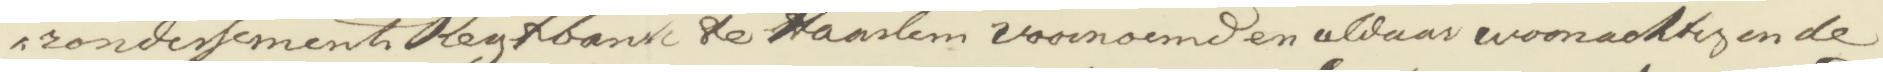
„rondissements Regtbank te Haarlem voornoemd en aldaar woonachtig in de
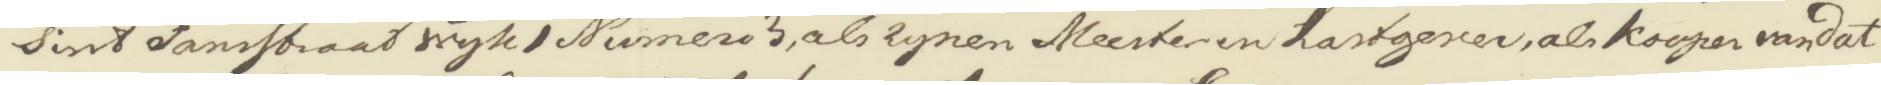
sint Jansstraat wyk 1 Numero 3, als zynen Meester en Lastgever, als kooper van dat
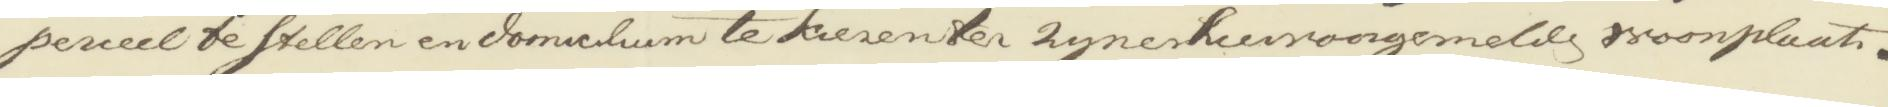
perceel te stellen en domicilium te kiezen ter zyner hiervoorgemelde woonplaats.
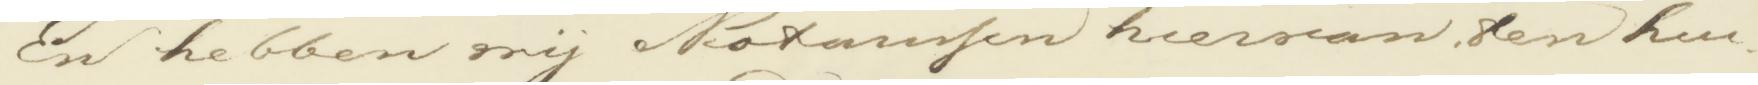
En hebben wij Notarissen hiervan, ten hui
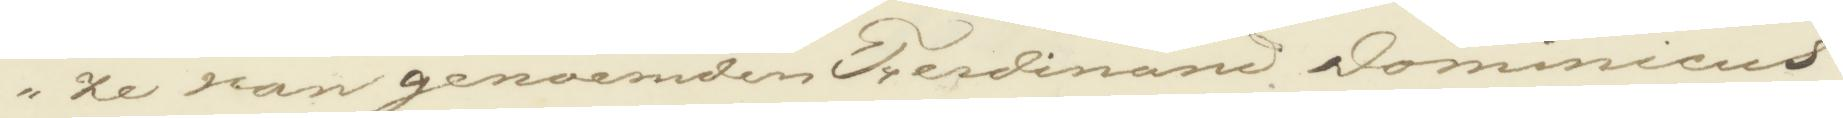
„ze van genoemden Ferdinand Dominicus
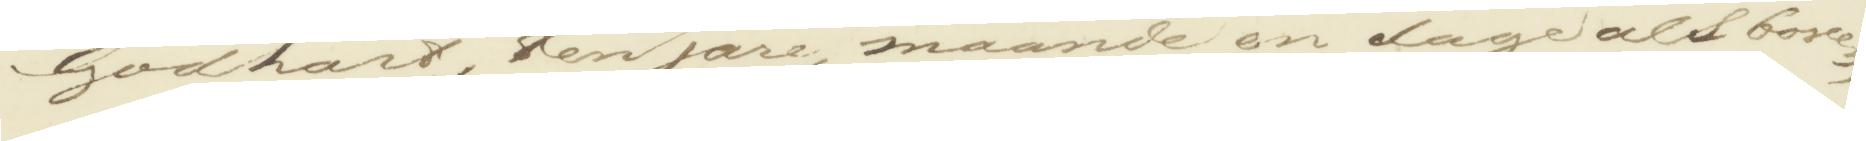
Godhart, ten jare, maande en dage als boven,
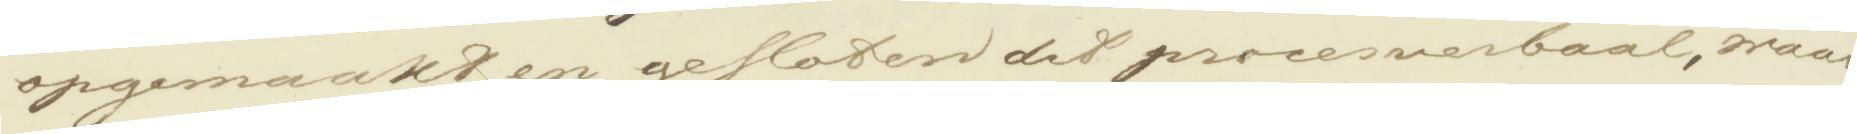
opgemaakt en gesloten dit procesverbaal, waar
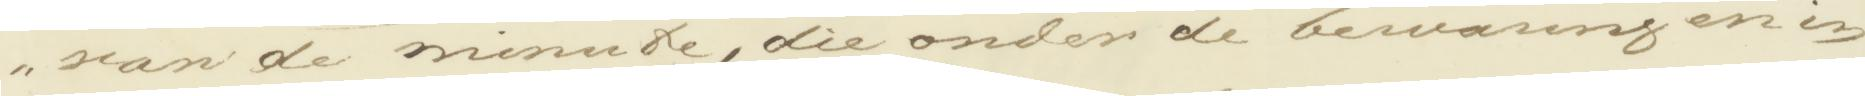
„van de minute, die onder de bewaring en in
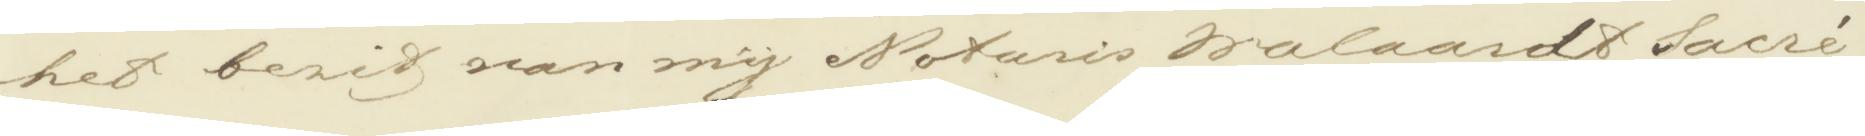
het bezit van mij Notaris Walaardt Sacré
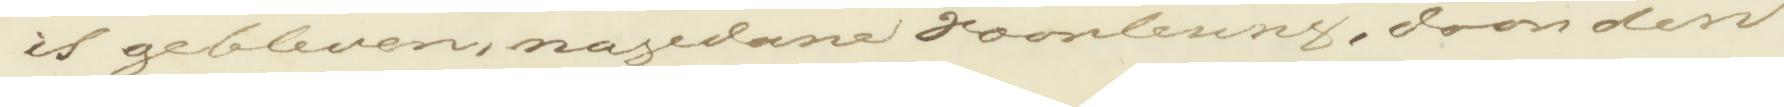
is gebleven, nagedane voorlezing, door den
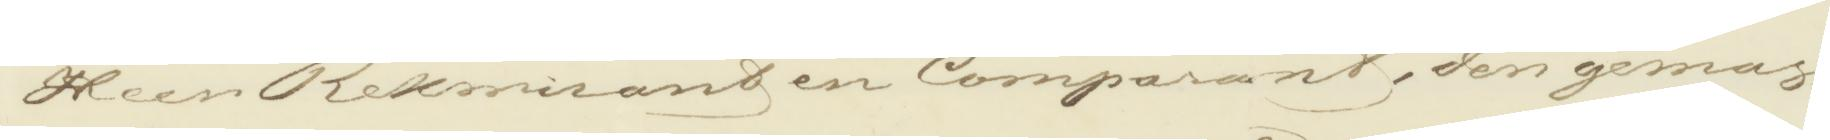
Heer Rekwirant en Comparant, den gemag
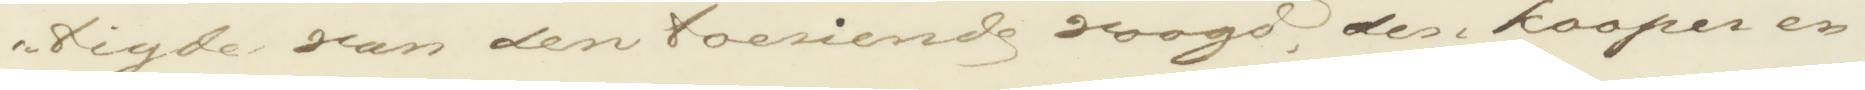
„tigde van den toezienden voogd, den kooper en
